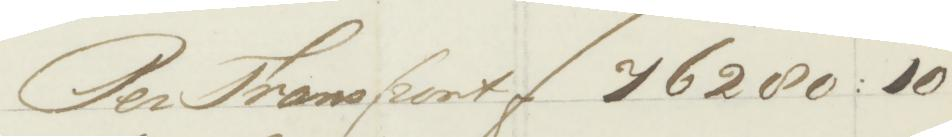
Per Transport ƒ 76280: 10
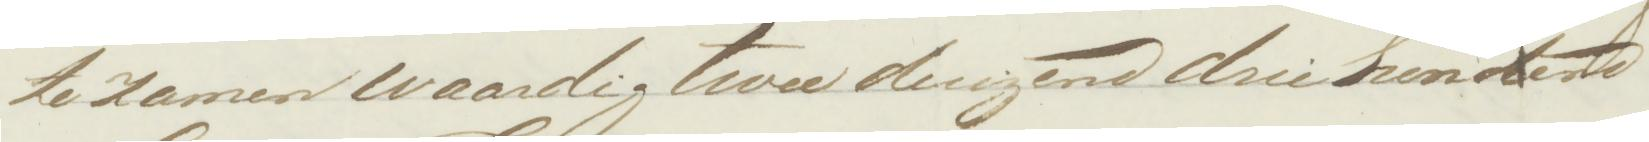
te zamen waardig twee duizend drie honderd
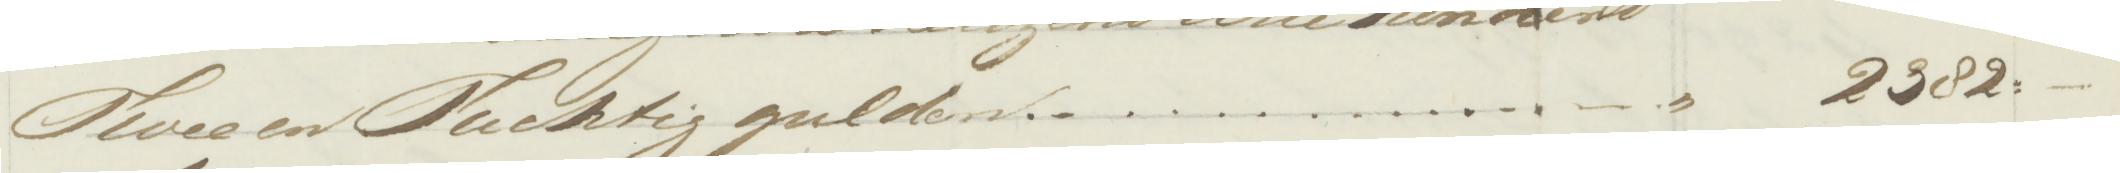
Twee en Tachtig gulden. - . . . . . . . . . - . . . . „ 2382: —
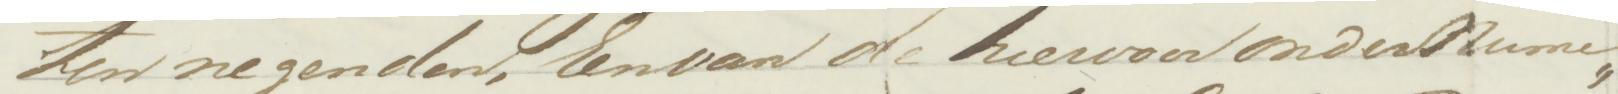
ten negenden, Een van de hiervoor onder Nume„
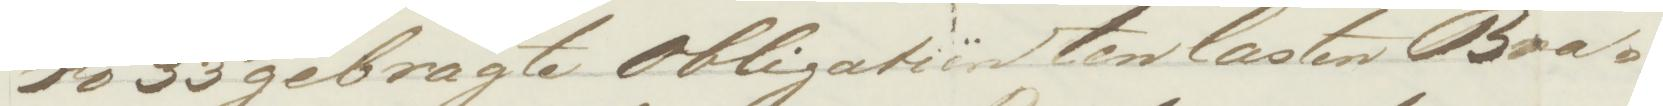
ro 33 gebragte Obligatien ten lasten Bra
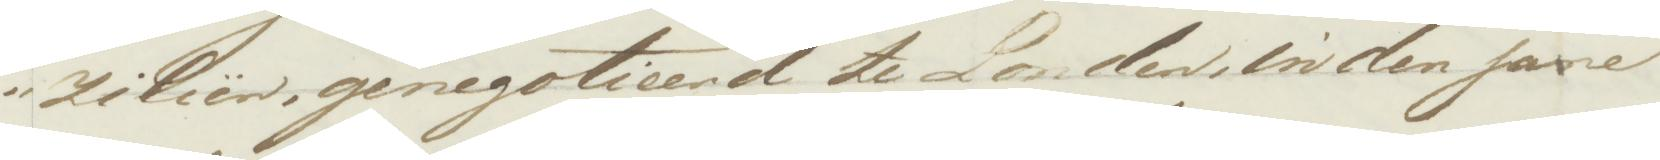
„zilien, genegotieerd te Londen, in den jare
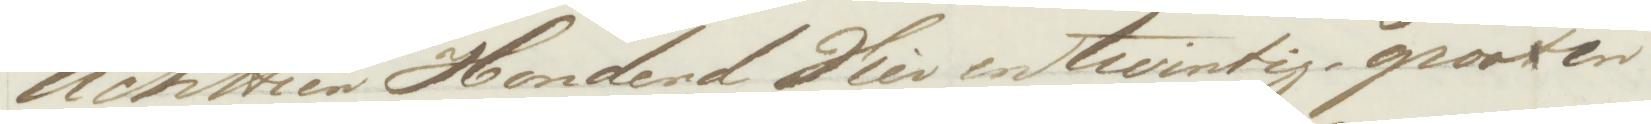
Achttien Honderd Vier en twintig, groot in
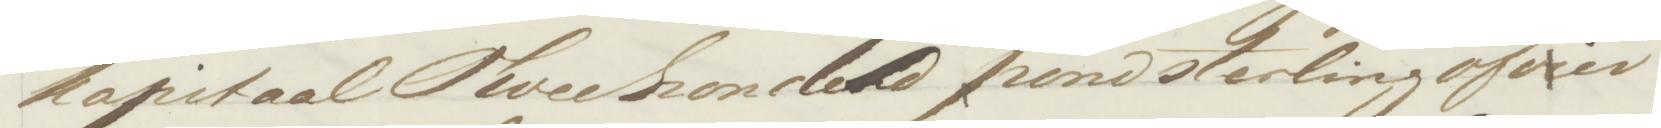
kapitaal Tweehonderd pond sterling of vier
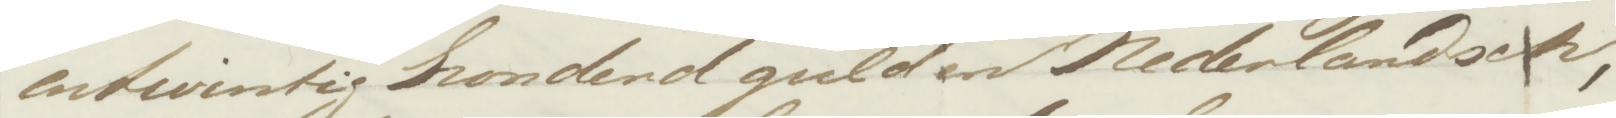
en twintig honderd gulden Nederlandsch,
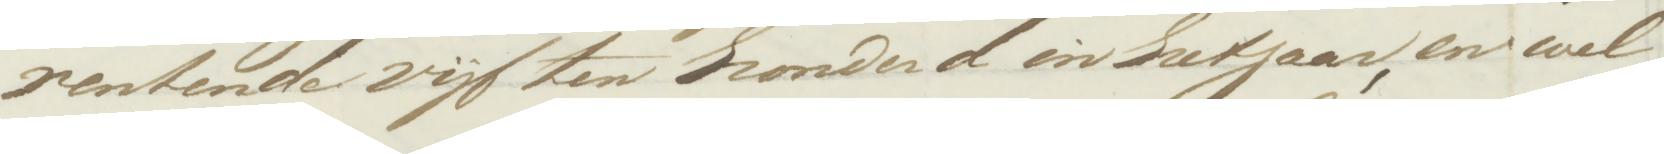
rentende vijf ten honderd in het jaar, en wel
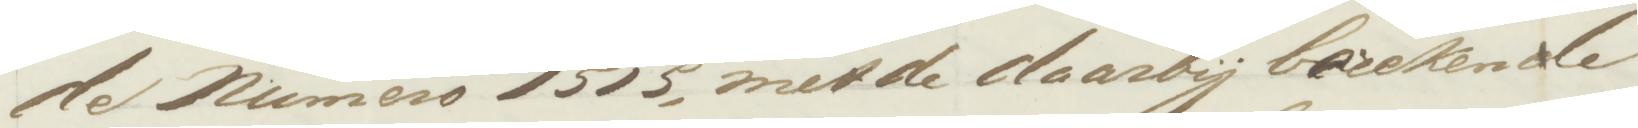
de Numero 1515, met de daarbij berekende
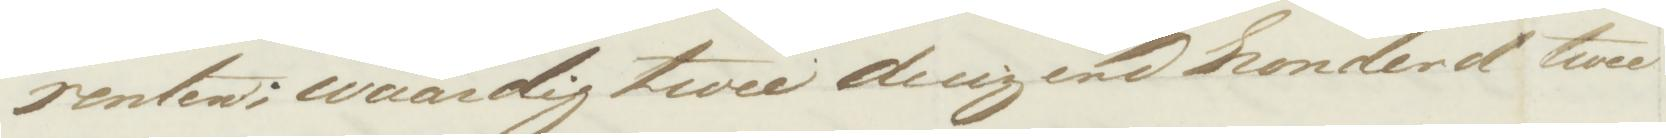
renten; waardig twee duizend honderd twee
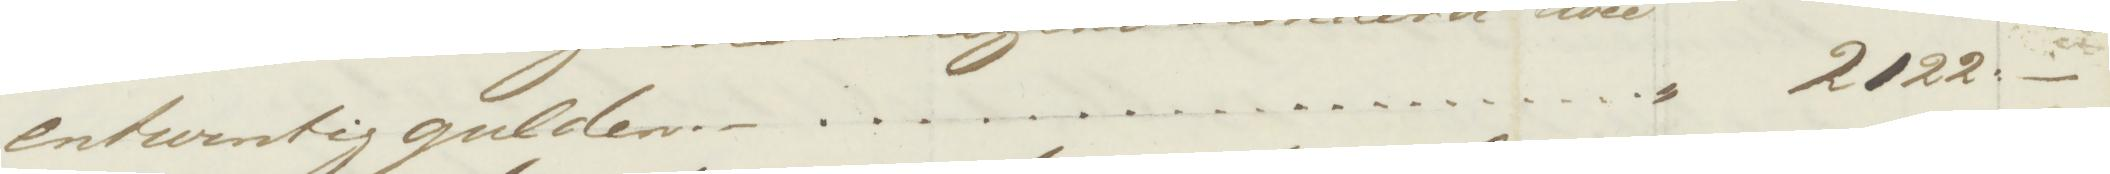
entwintig gulden.- . . . . . . . . . . . . . . . . . . . . „ 2122: —
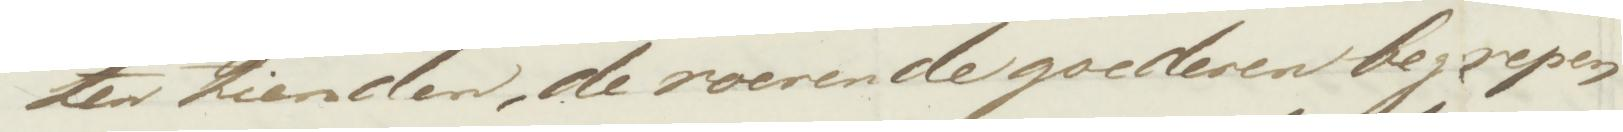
ten tienden, de roerende goederen begrepen
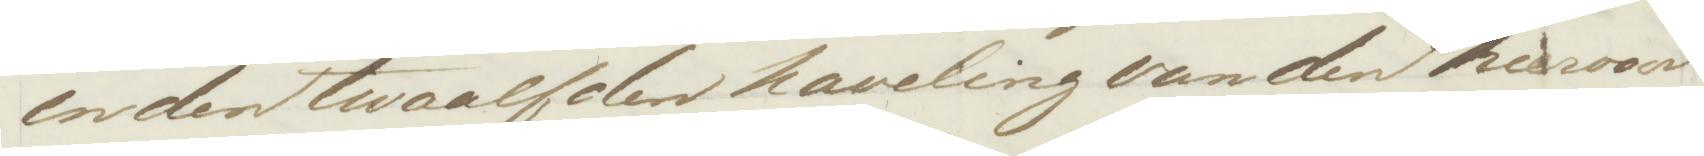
en den twaalfden kaveling van den hiervoor
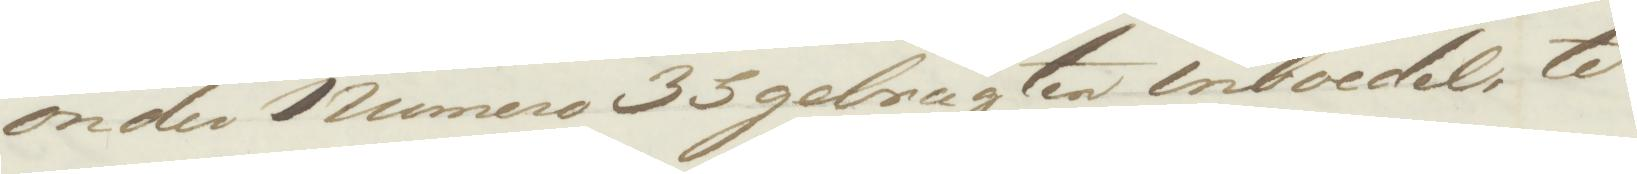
onder Numero 35 gebragten inboedel, te
